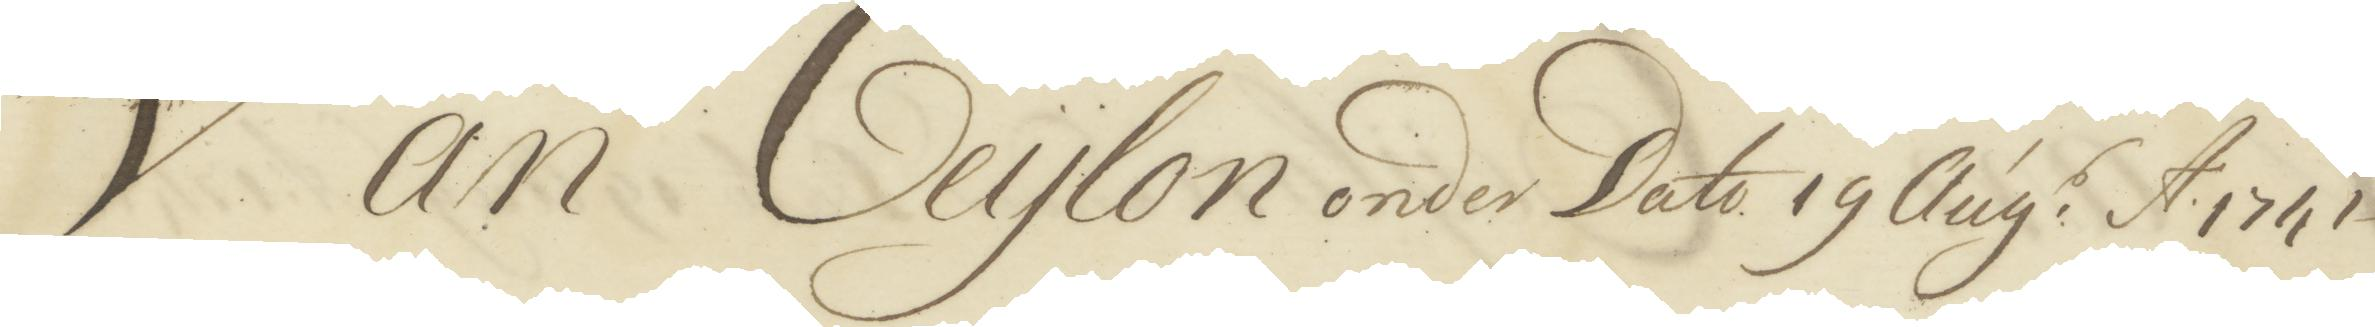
Van Ceijlon onder Dato 19 Aug:s A. 1741
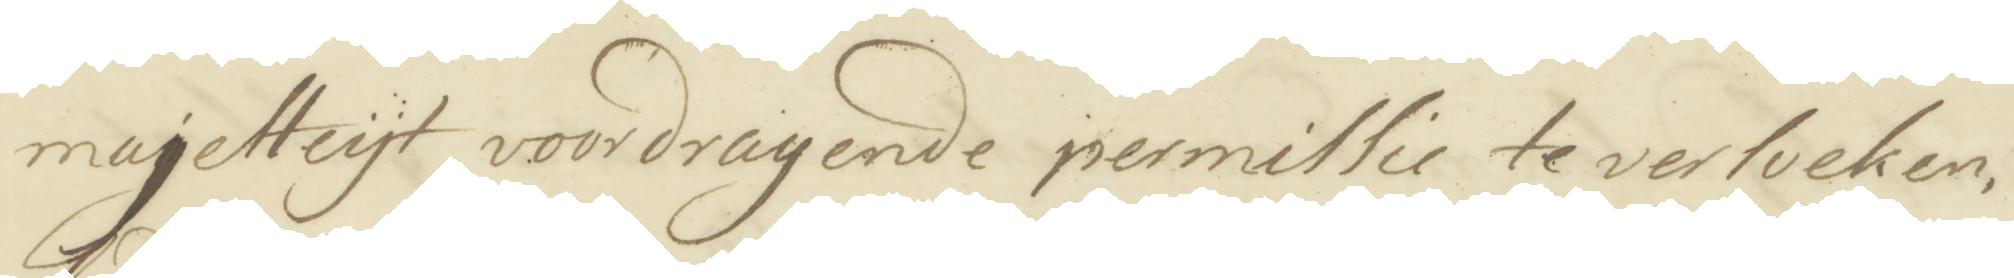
majesteijt voordragende permissie te versoeken,
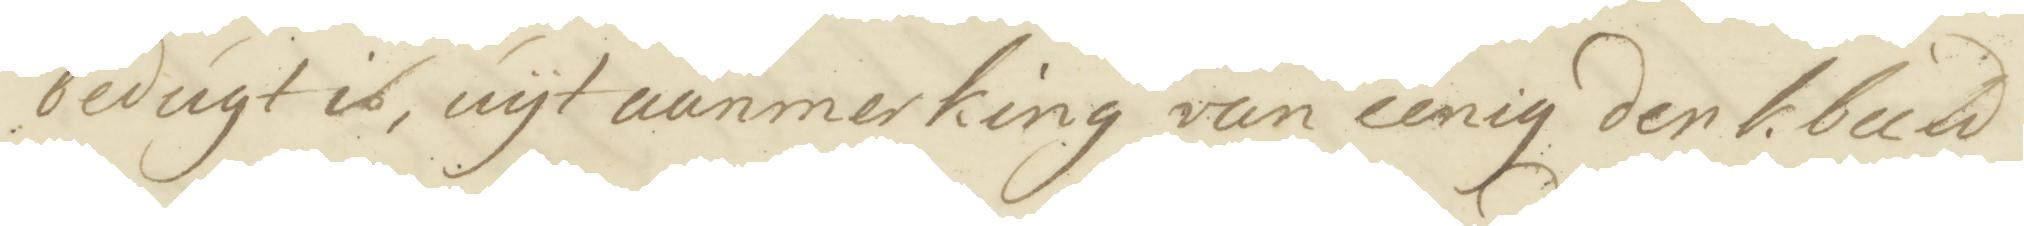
bedugt is, uijt aanmerking van eenig denkbeeld
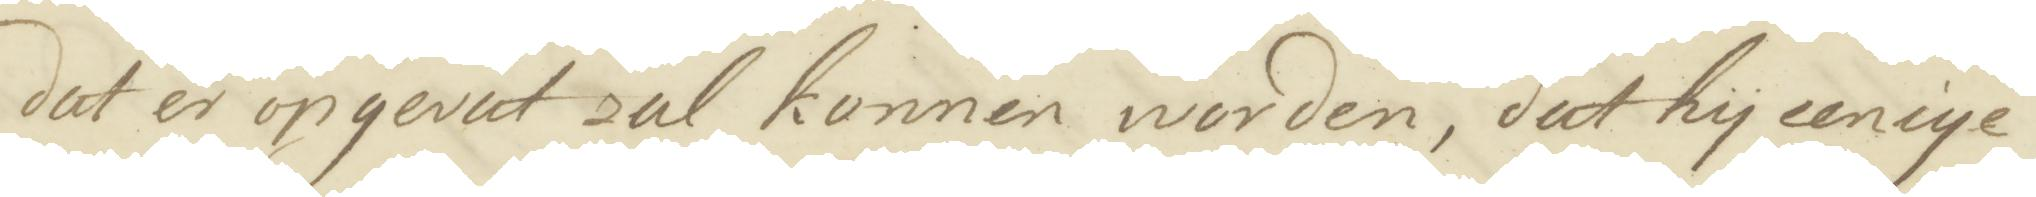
dat ër opgevat zal konnen worden, dat hij eenige
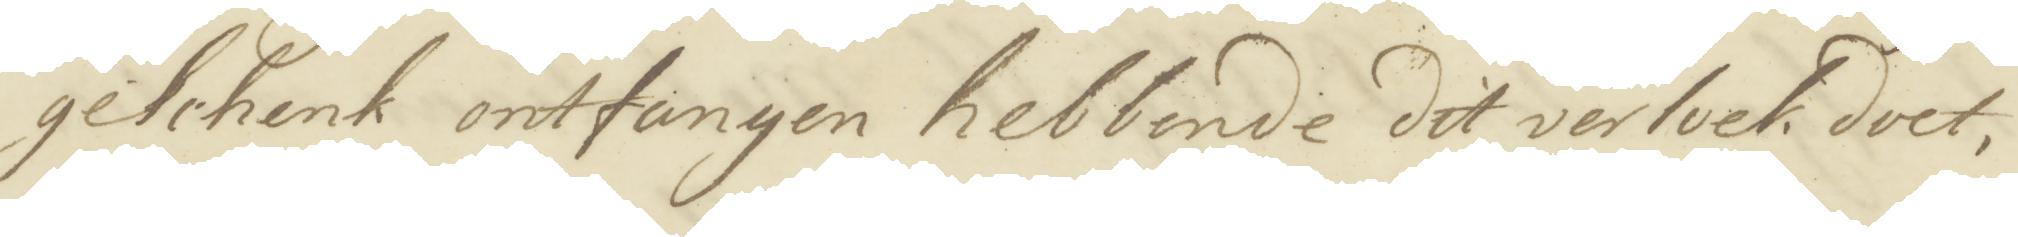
geschenk ontfangen hebbende dit versoek doet,
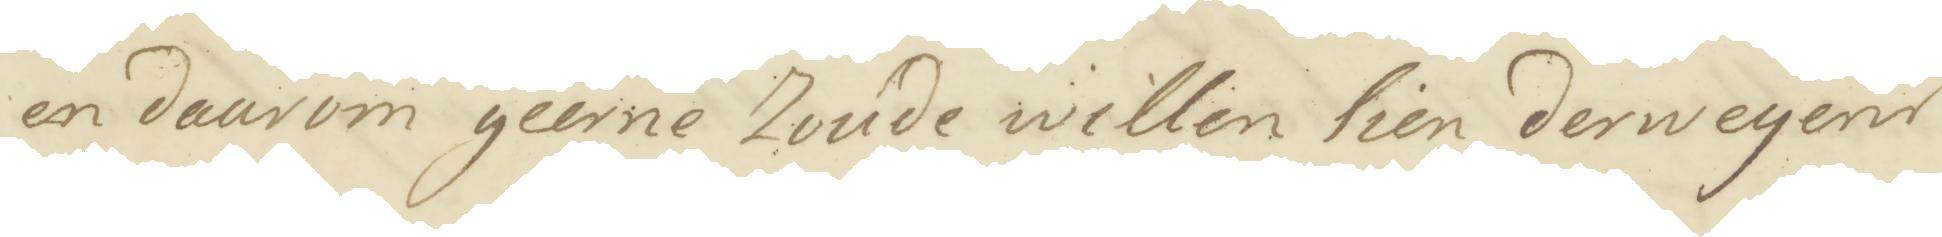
en daarom geerne zoude willen sien derwegens
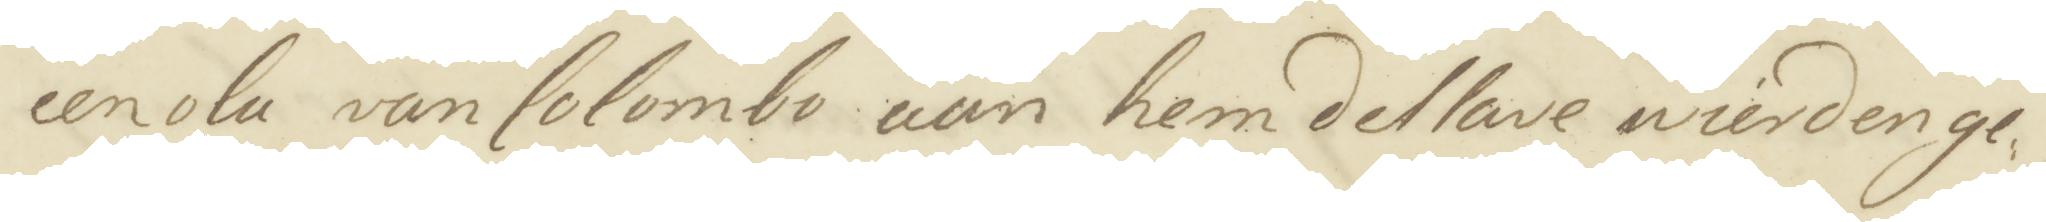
een ola van Colombo aan hem dessave wierden ge„
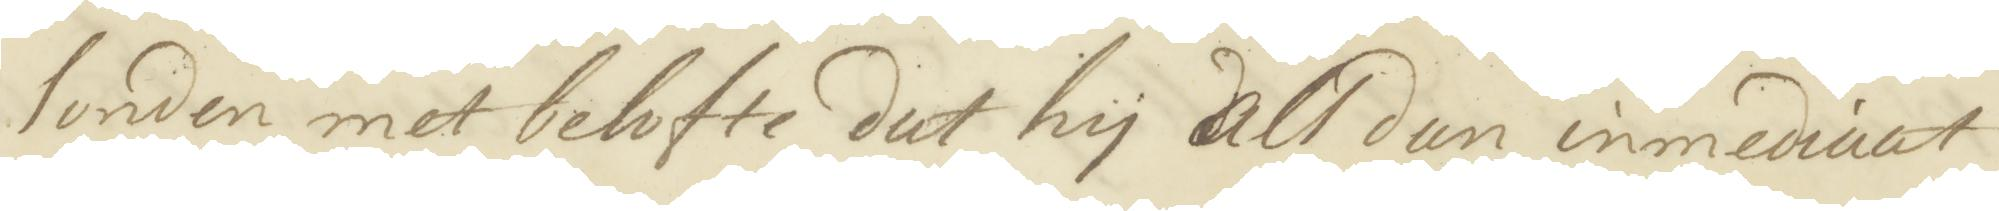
sonden met belofte dat hij als dan inmediaat
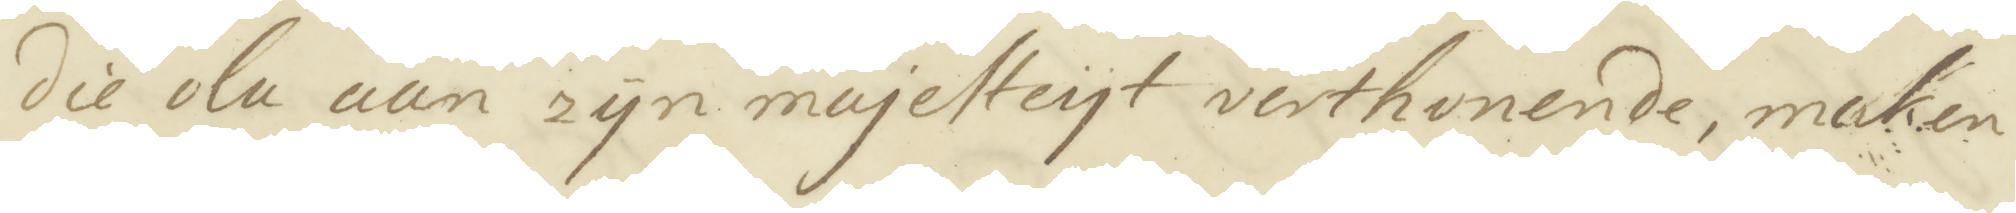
die ola aan zijn majesteijt verthonende, maken
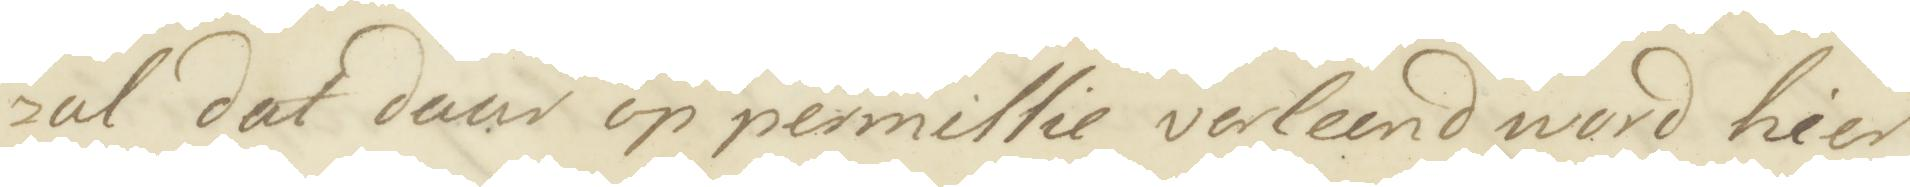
zal dat daar op permissie verleend word hier
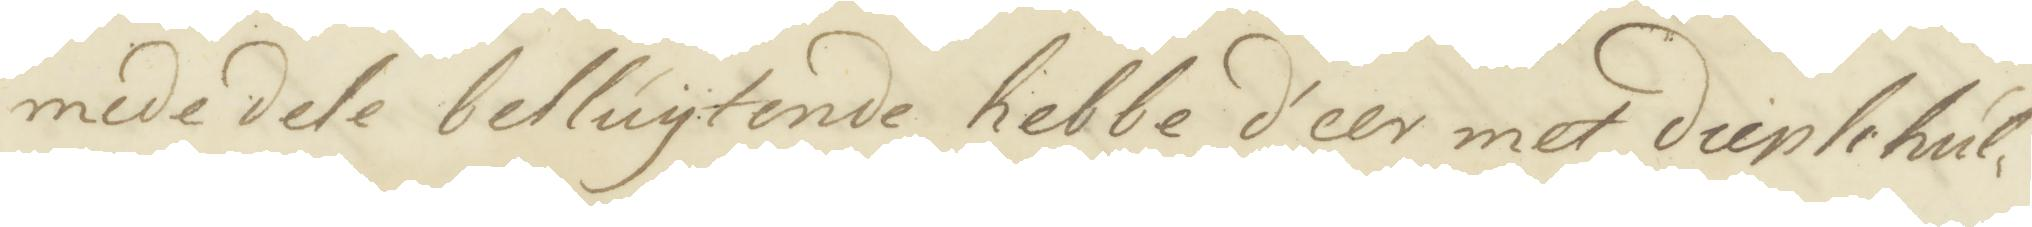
mede dese besluijtende hebbe d’eer met dienschul„
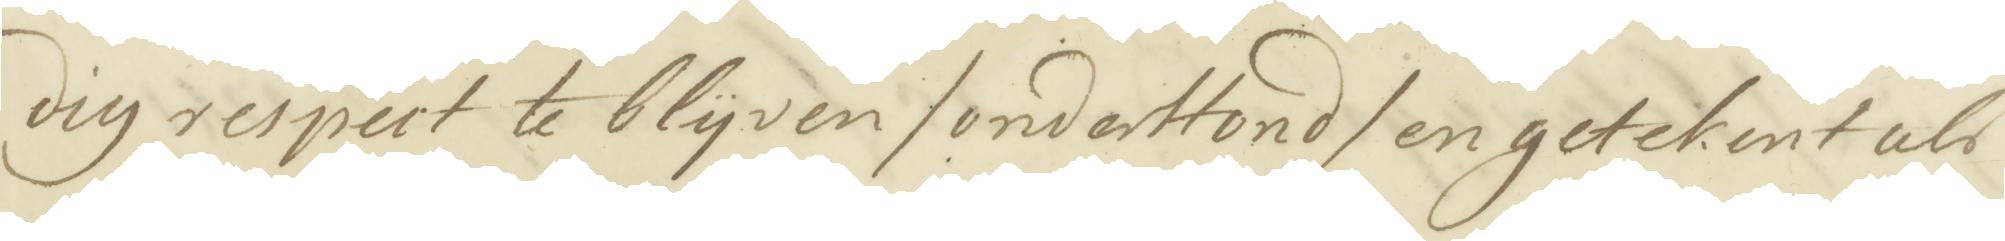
dig respect te blijven /onderstond/ en getekent als
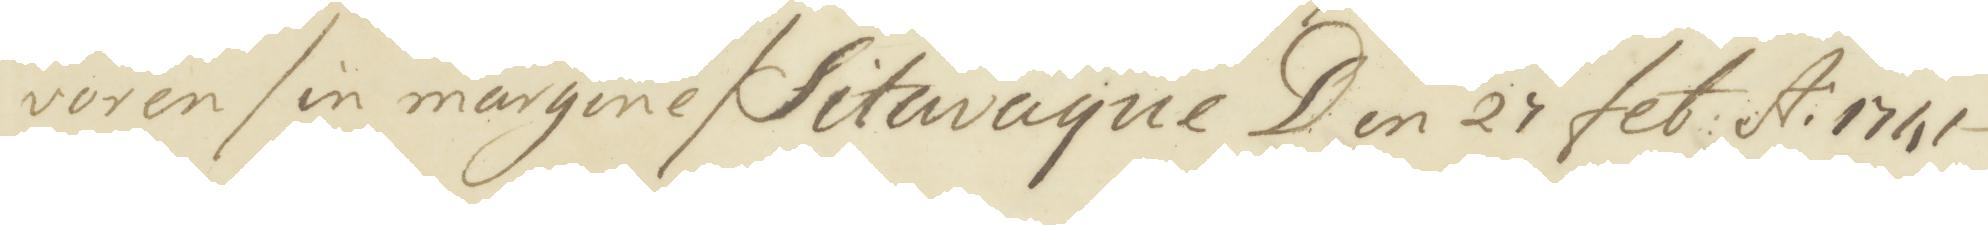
voren /in margine/ Sitavaque Den 27 feb: A. 1741
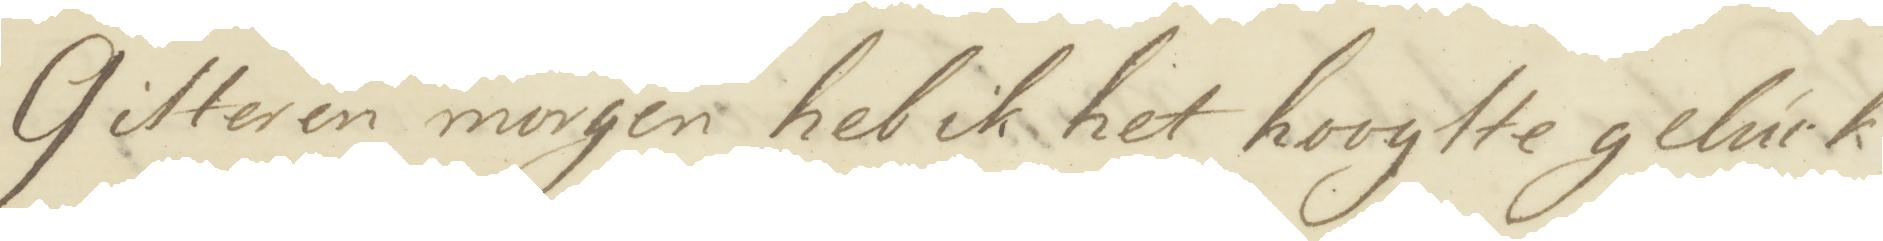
Gisteren morgen heb ik het hoogste geluck
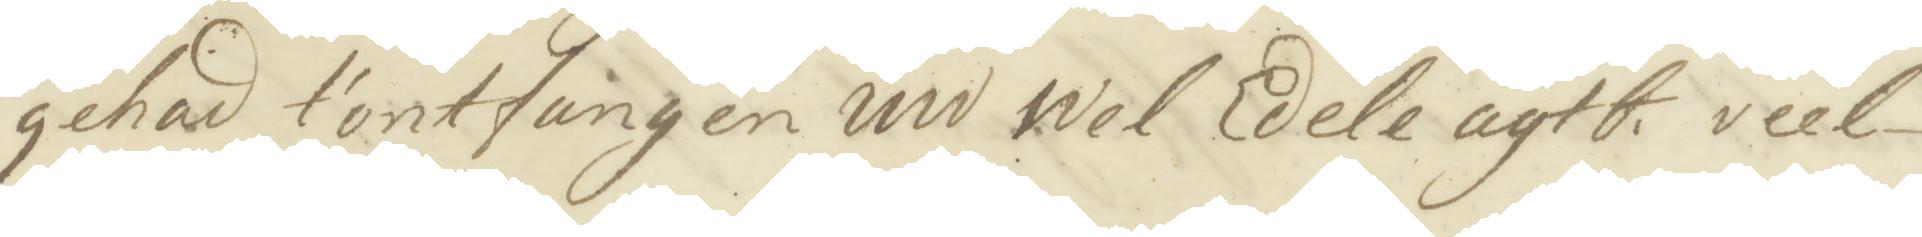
gehad t'ontfangen uw wel Edele agtb: veel
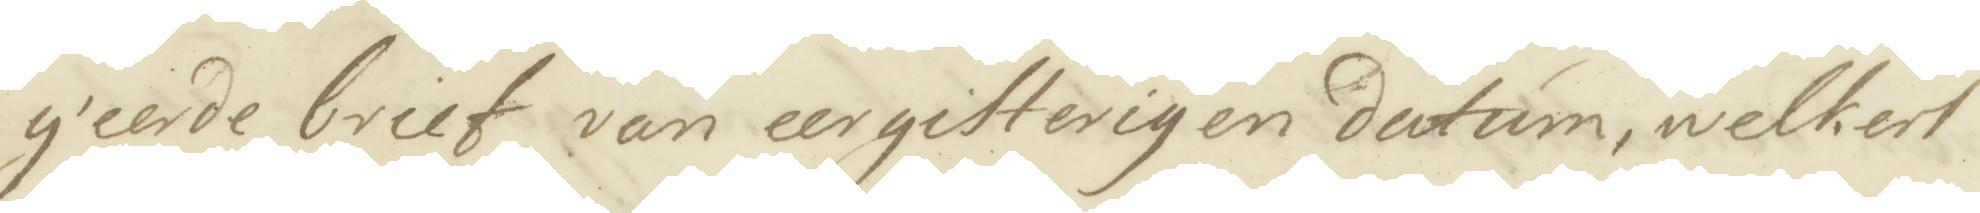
g'eerde brief van eergisterigen datum, welkert
